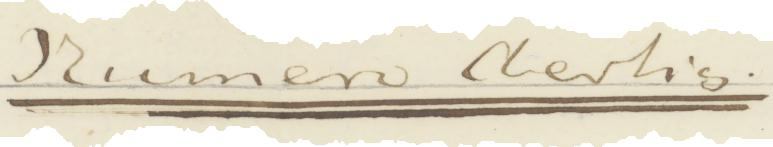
Numero dertig
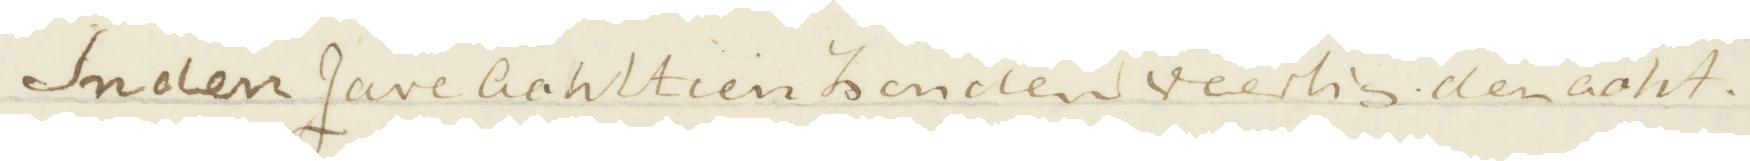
In den Jare Achttien honderd veertig den acht.
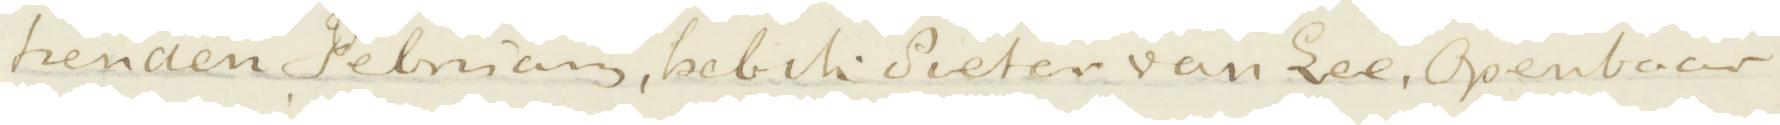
tienden Ferbruarij, heb ik Pieter van Lee Openbaar
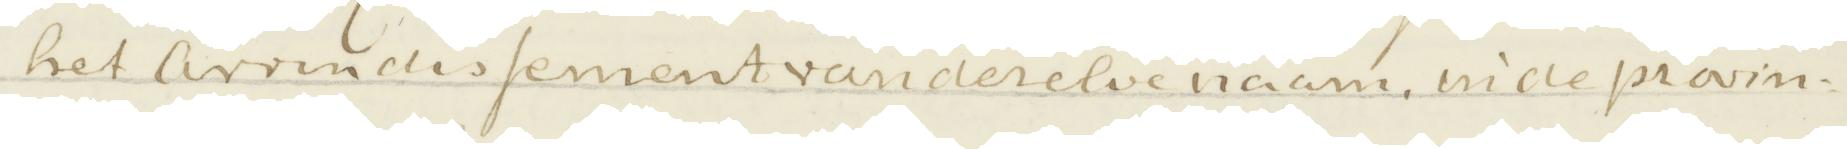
het Arrondissement van dezelve naam in de provin-
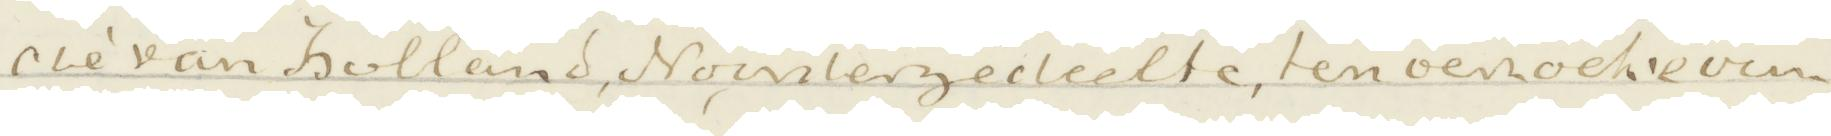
cie van holland, Noorder gedeelte, ten verzoeke van
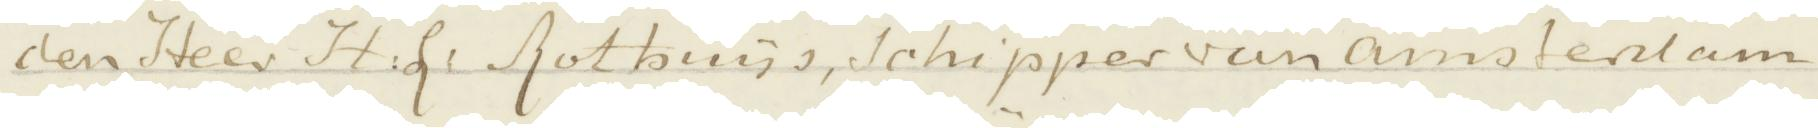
den Heer H:L Rothuijs, schipper van Amsterdam
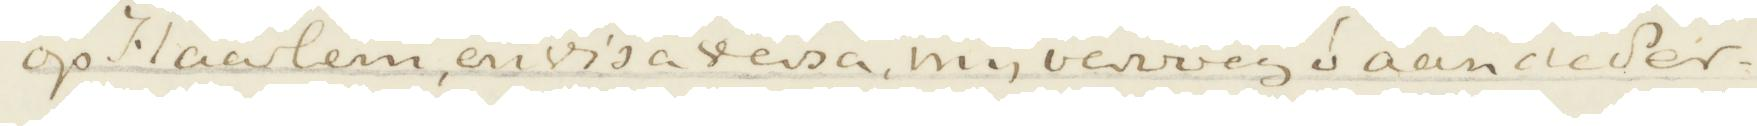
op Haarlem en visa versa mij vervoegd aan de Per-
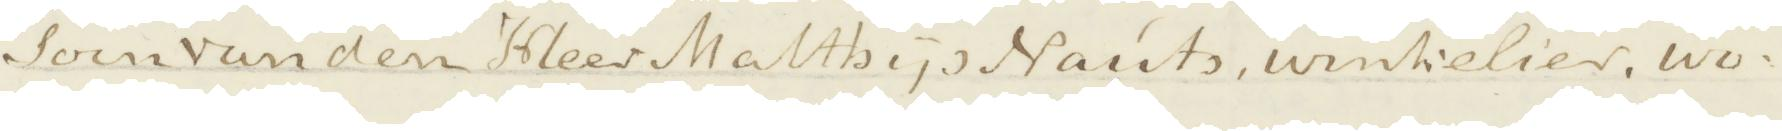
Soon van den Heer Matthijs Nauts, winkelier, wo-
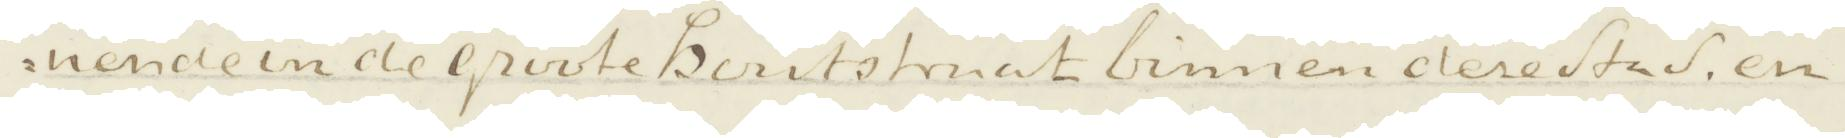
„nende in de groote houtstraat binnen deze stad, en
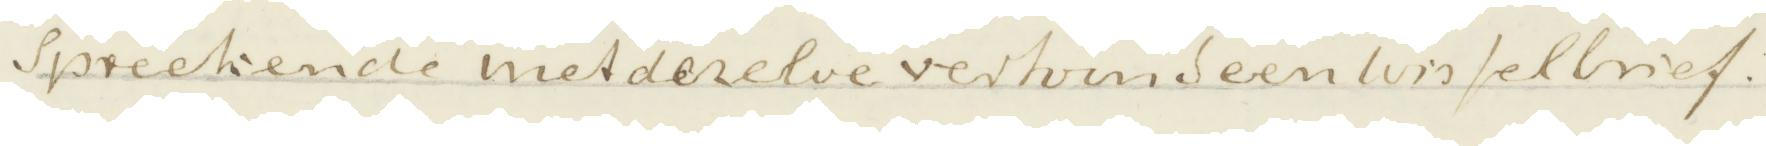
spreekende met dezelve vertoond een wisselbrief.
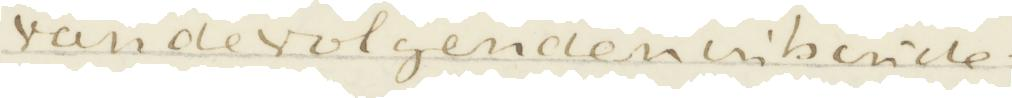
van de volgenden inhoude
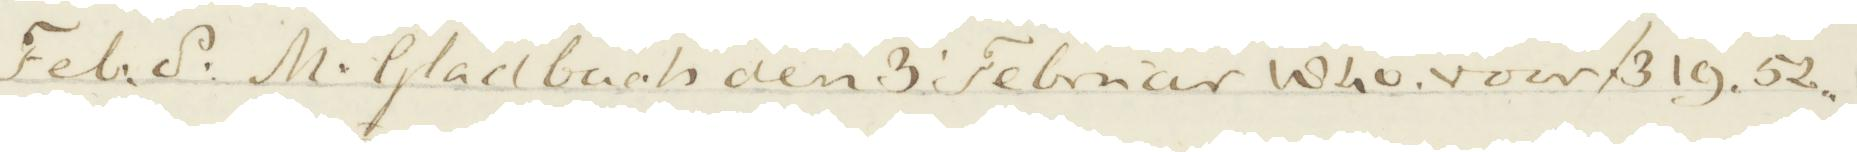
Feb: S: M. Gladbach den 3: Februar 1840. voor ƒ319, 52. „
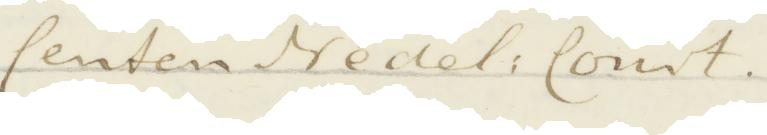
Centen Nedel: Court.
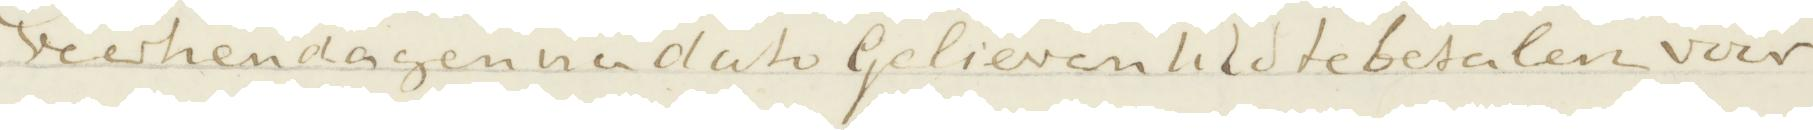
veertien dagen na dato Gelieven U Ed te betalen voor
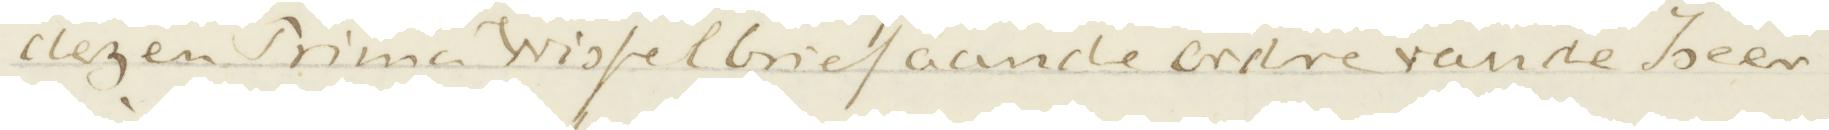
dezen Prima Wisselbrief aan de ordre van de heer
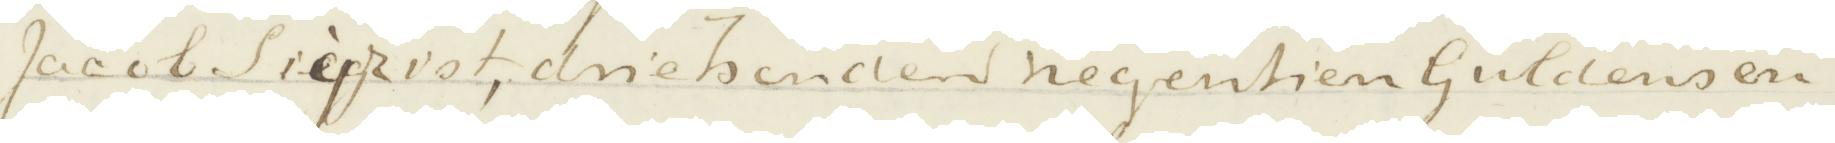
Jacob Sieggrist, drie honderd negentien Guldens en
